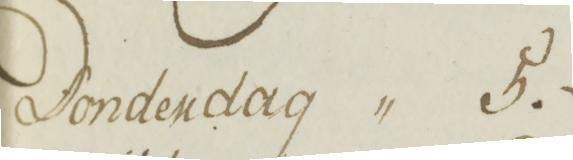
Donderdag „ 5.
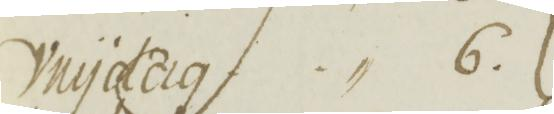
Vrijdag - - „ 6.
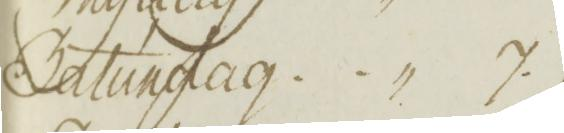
Saturdag - - „ 7.
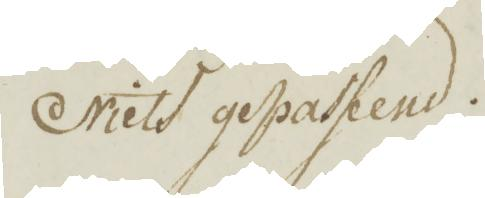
Niets gepasseerd.
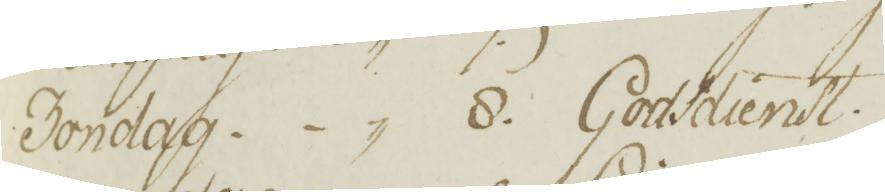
Sondag - - „ 8. Godsdienst.
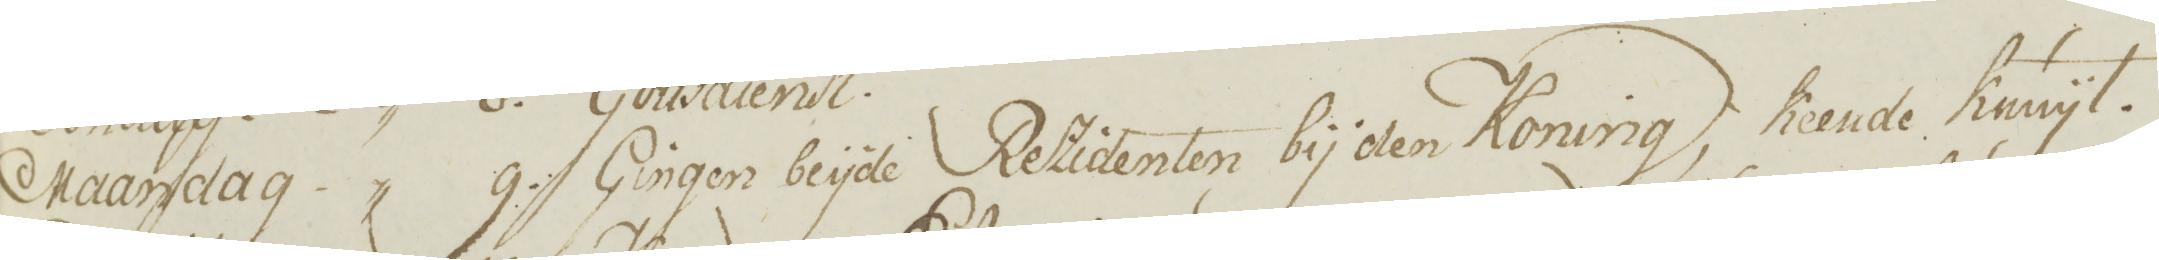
Maandag .. „ 9: Gingen beijde Rezidenten bij den Koning, keerde kruijt.
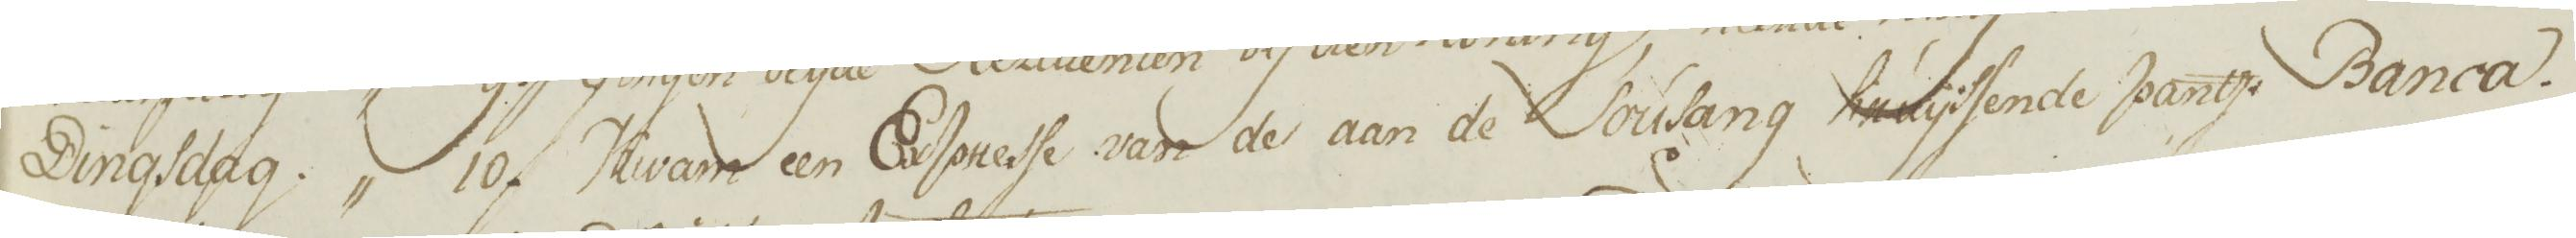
Dingsdag .. „ 10. kwam een Expresse van de aan de sousang kruijssende pantj: Banca.
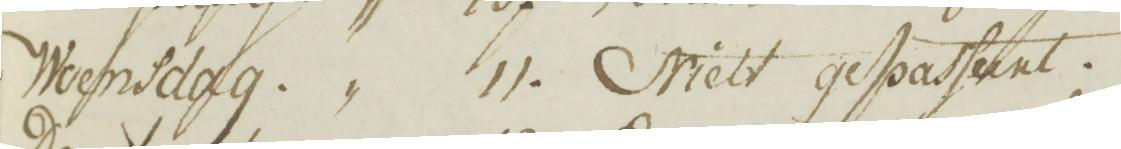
Woensdag- „ 11. Niets gepasseert.
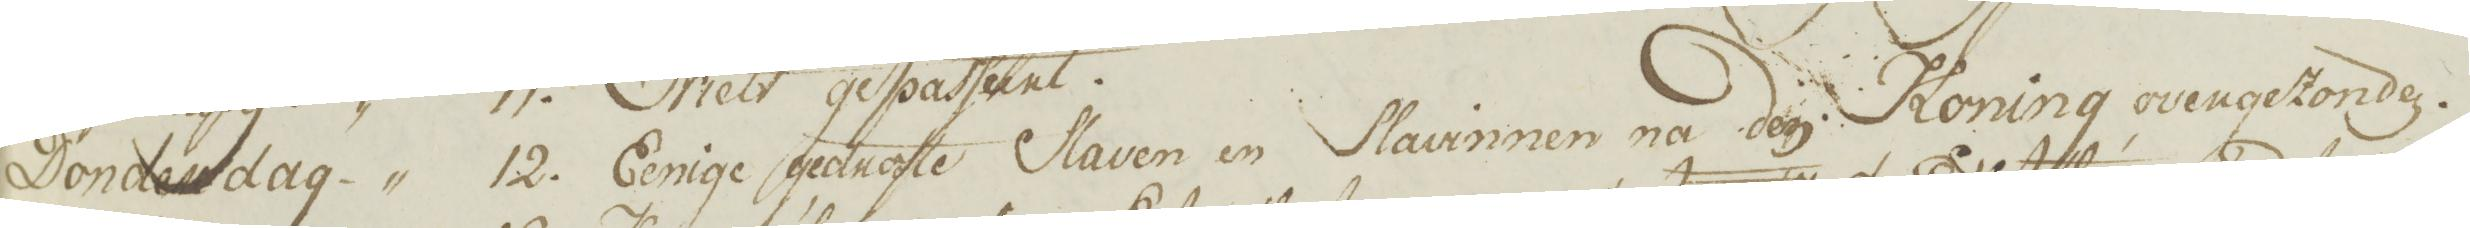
Donderdag - „ 12. Eenige gedroste slaven en slavinnen na den Koning overgezonden.
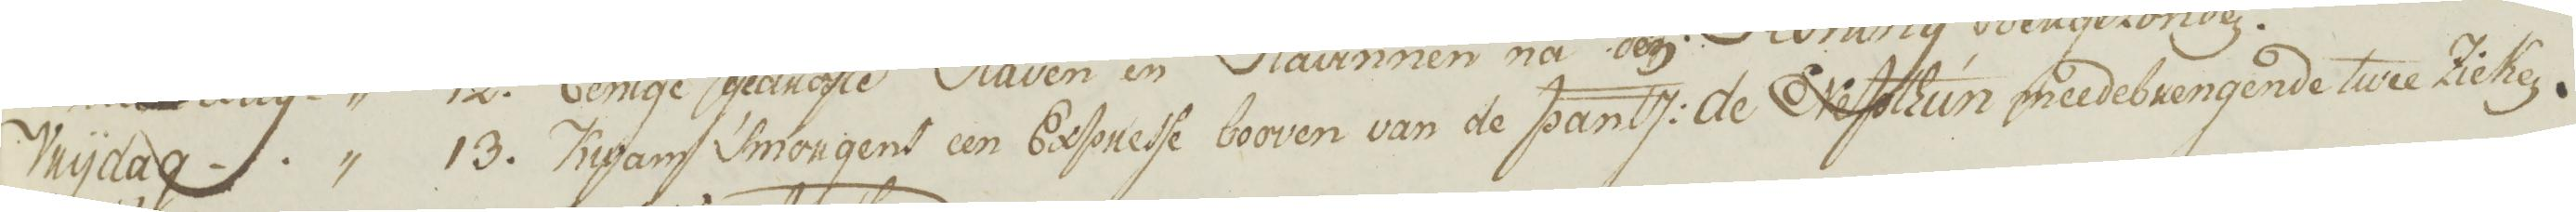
Vrijdag - - „ 13. Kwam 'smorgens een Expresse booven van de pantj: de Nepthun meedebrengende twee Zieken.
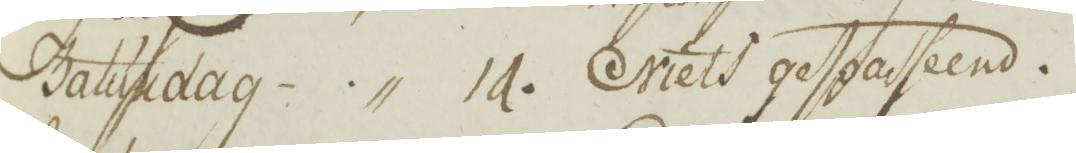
Saturdag - - „ 14. Niets gepasseerd.
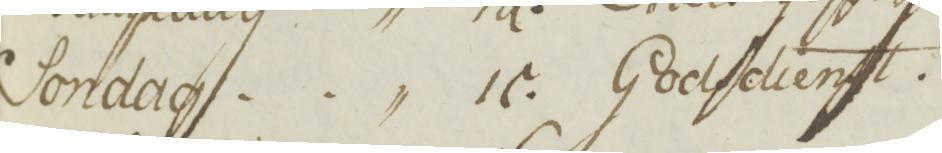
Sondag - - „ 15. Goddienst.
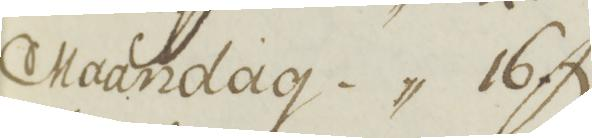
Maandag - „ 16.
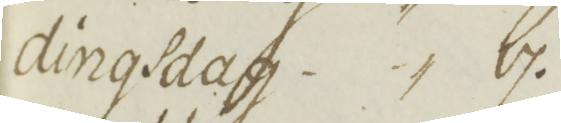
dingsdag - - „ 17.
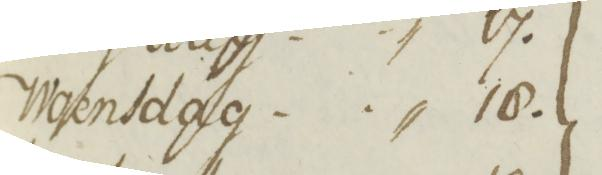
Woensdag - - „ 18.
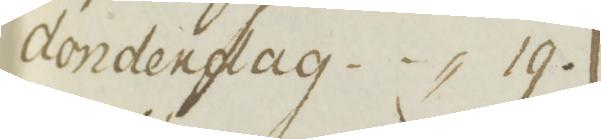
donderdag - - „ 19.
